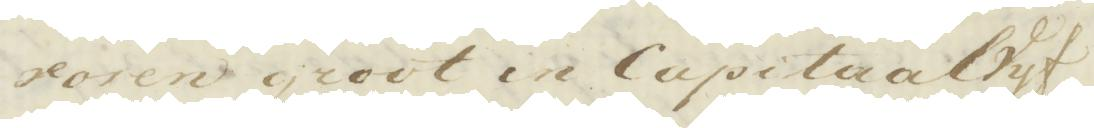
voren groot in Capitaal Vyf
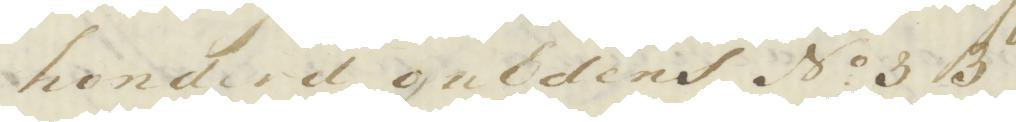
honderd guldens, N:o 3 3
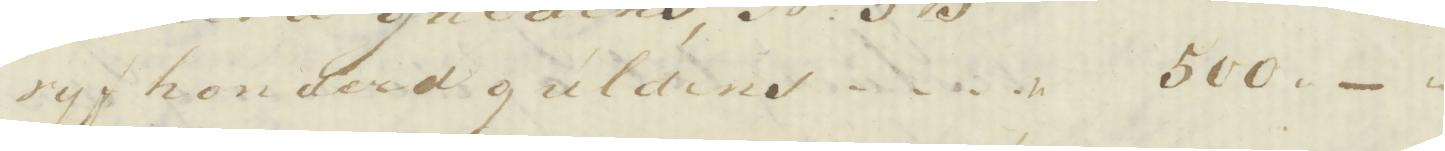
vijf honderd guldens - - - „ 500 „ — „
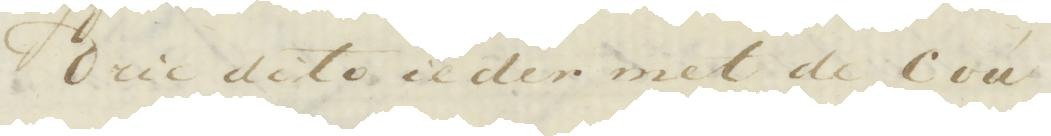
drie dito ieder met de Cou
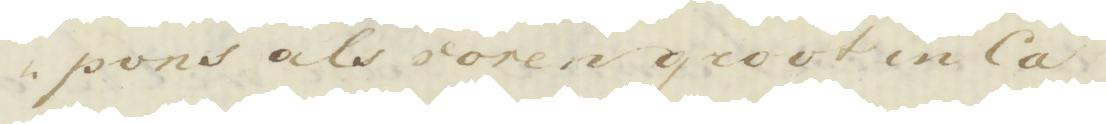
„pons als voren groot in Ca
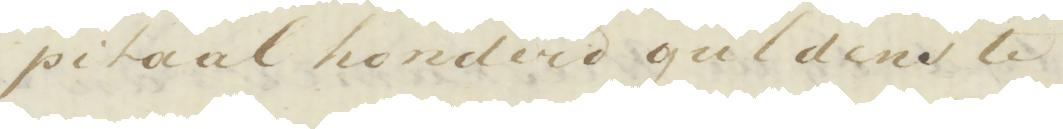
pitaal honderd guldens te
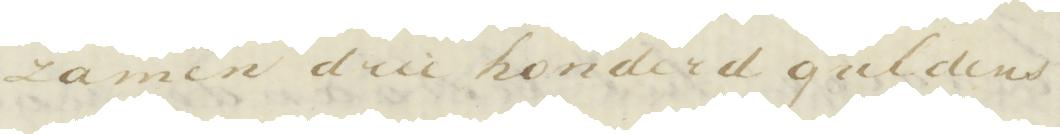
zamen drie honderd guldens
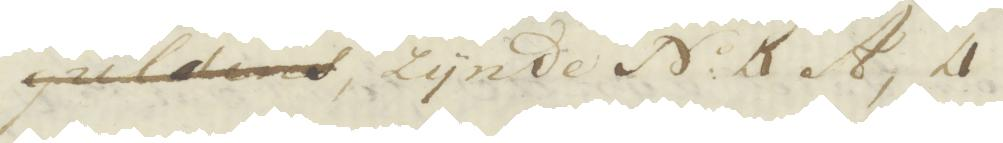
guldens, zijnde N: 4 A, 4
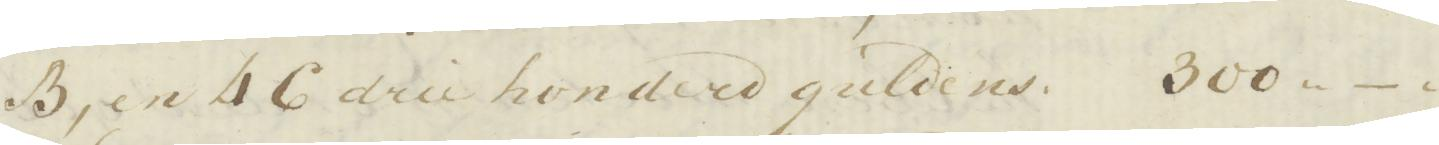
B, en 4 C drie honderd guldens. 300 „ — .
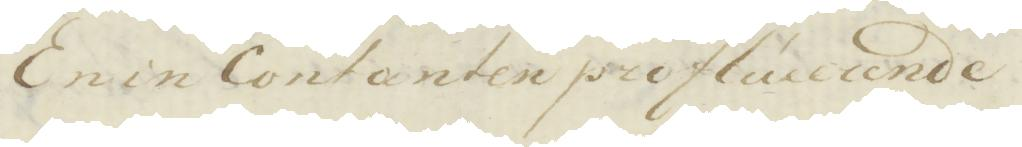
En in Contanten proflueerende
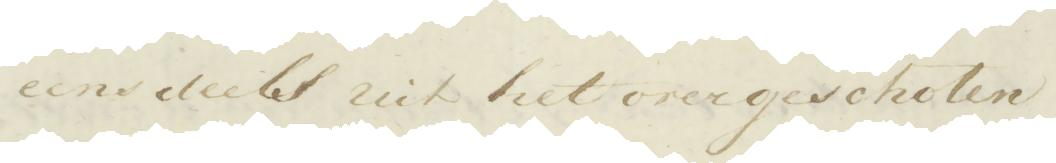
eens deels uit het over geschoten
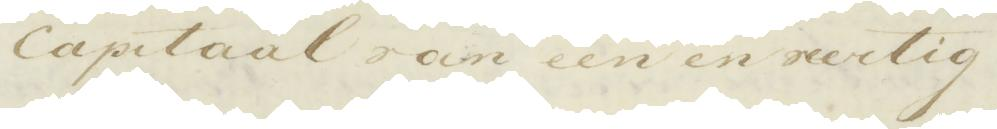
Capitaal van een en veertig
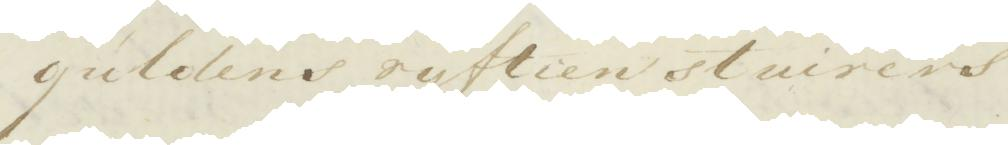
guldens vyftien stuivers
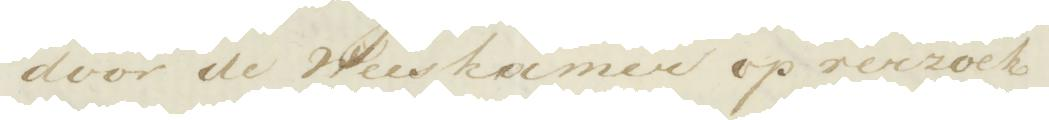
door de Weeskamer op verzoek
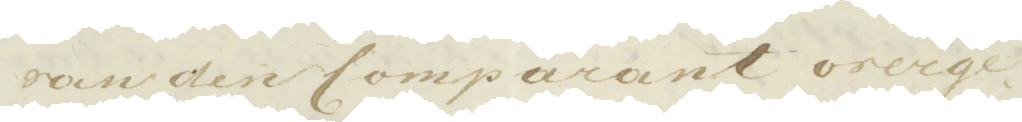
van den Comparant overge
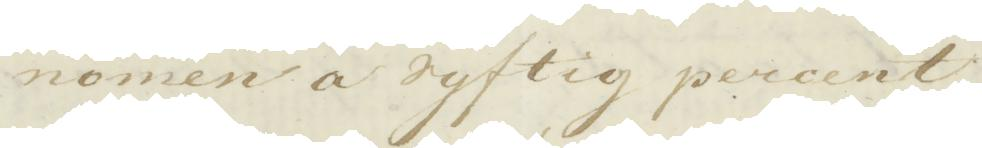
nomen a vyftig percent,
